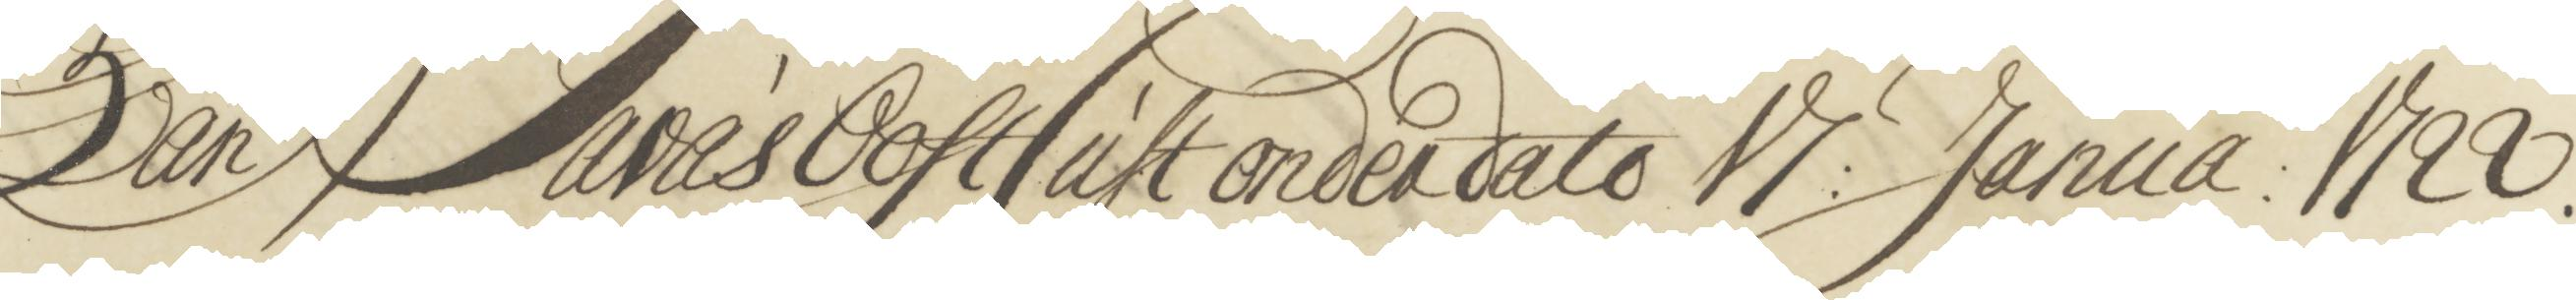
Van Java's Oost Cust onder dato 17:' Janua: 1722.
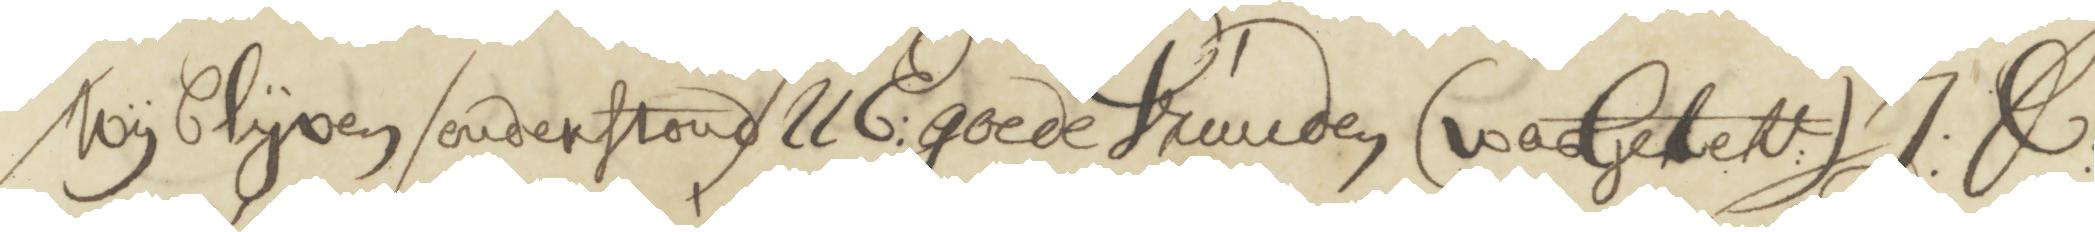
/wij blijven/onderstond/ UE: goede Vrunden (was Getek:t) J: f:
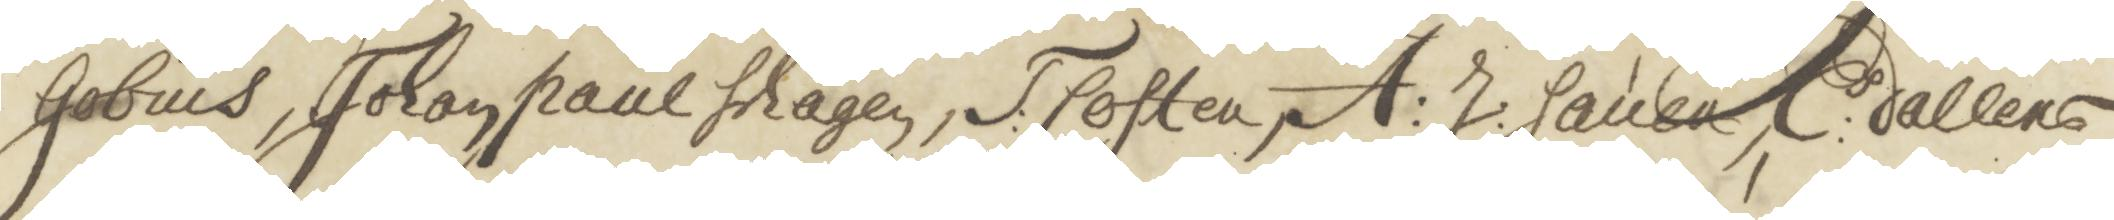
gobius, Johan paul Schagen, T: Coster, A: J: Sauer, E:s dallens,
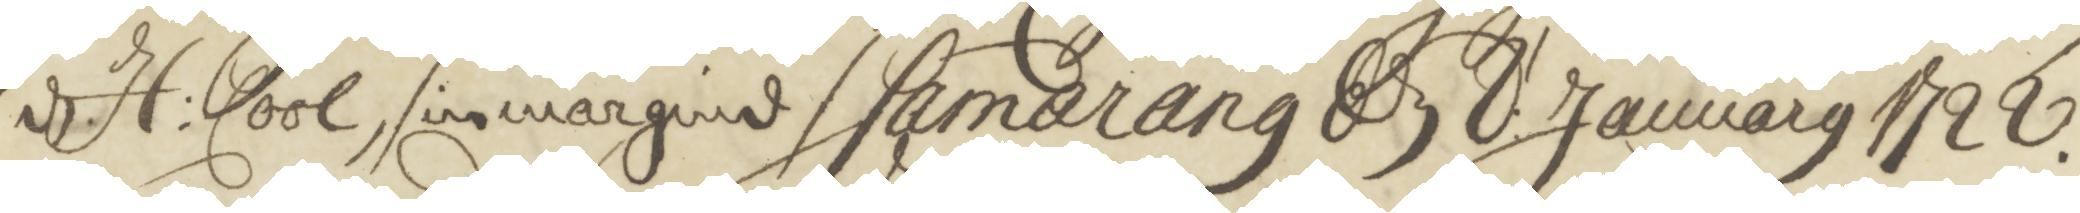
en H: Cool, /in margine / Samarang den 8: Januarij 1722.
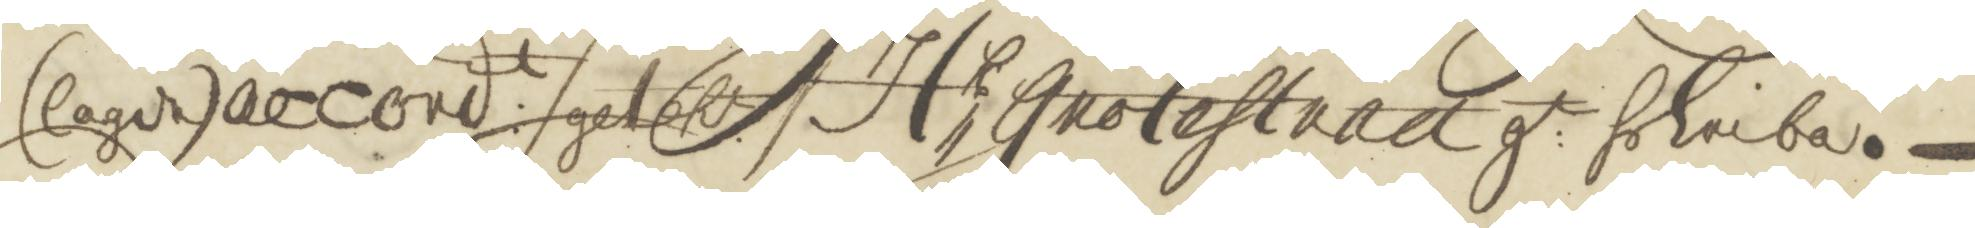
(lager) accord:t /getek:t / H„k Grotestraet g:t schriba. —
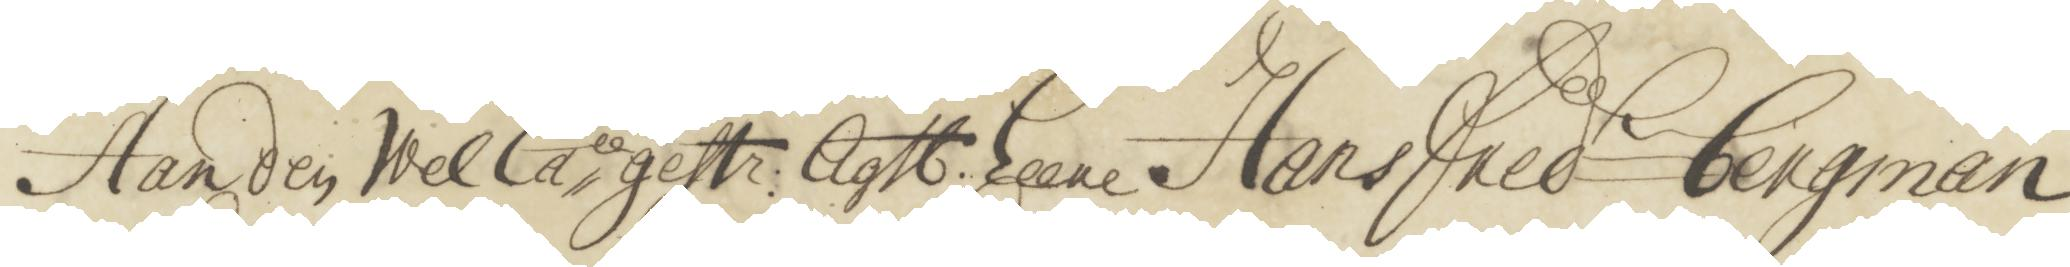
Aan den Wel Ed„le gestr: Agtb: heere Hans fred=k bergman
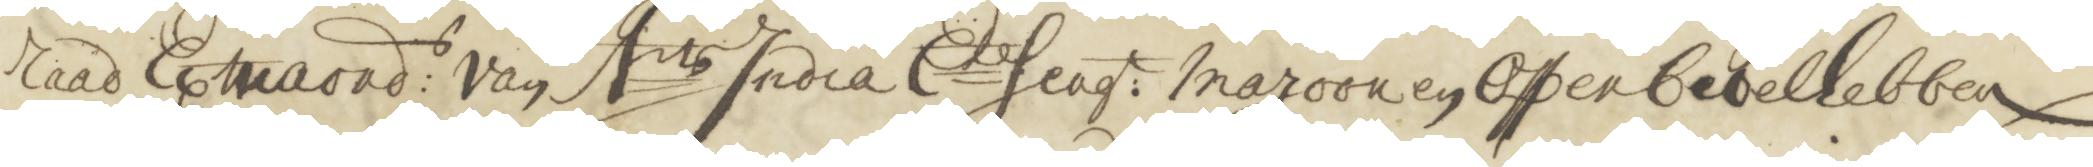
raad Extraord:s van N=ts Jndia E=de serg:t majoor en Opper bevelhebber
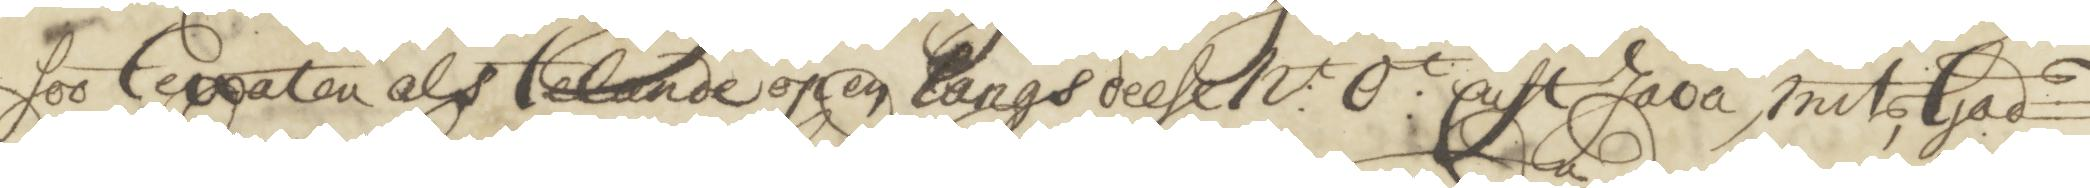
Soo te water als te lande op en langs deese N:t O:t Cust Java, mitsgad=s
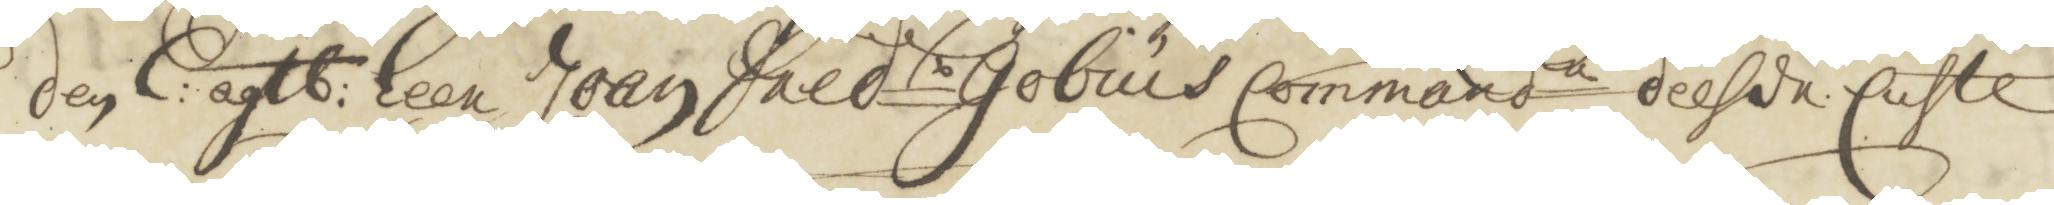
den E: agtb: heer Joan fred=s gobius Command=r deeser Custe
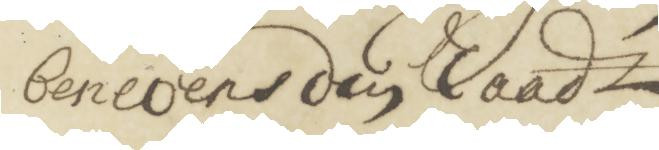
benevens den raad. —
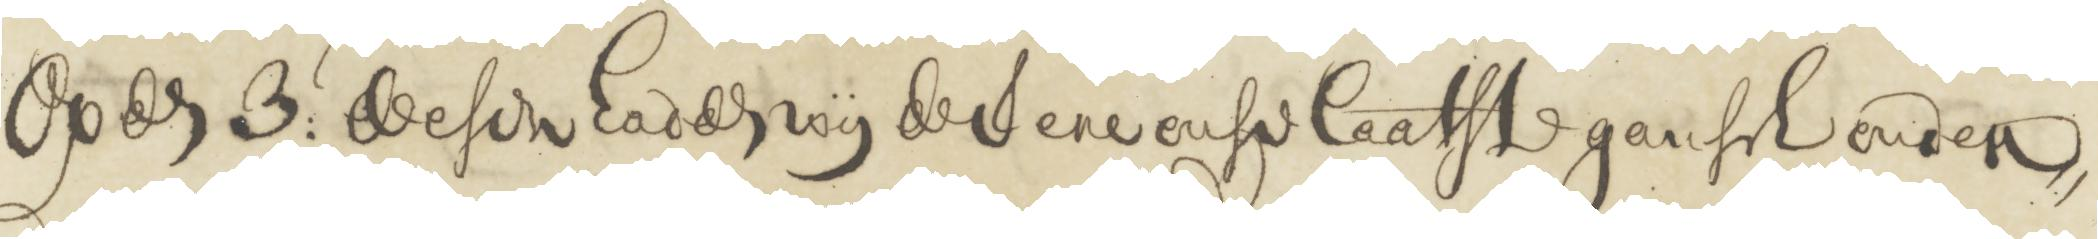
Op den 3:' deeser hadden wij de eere onse laatste gansch onder„
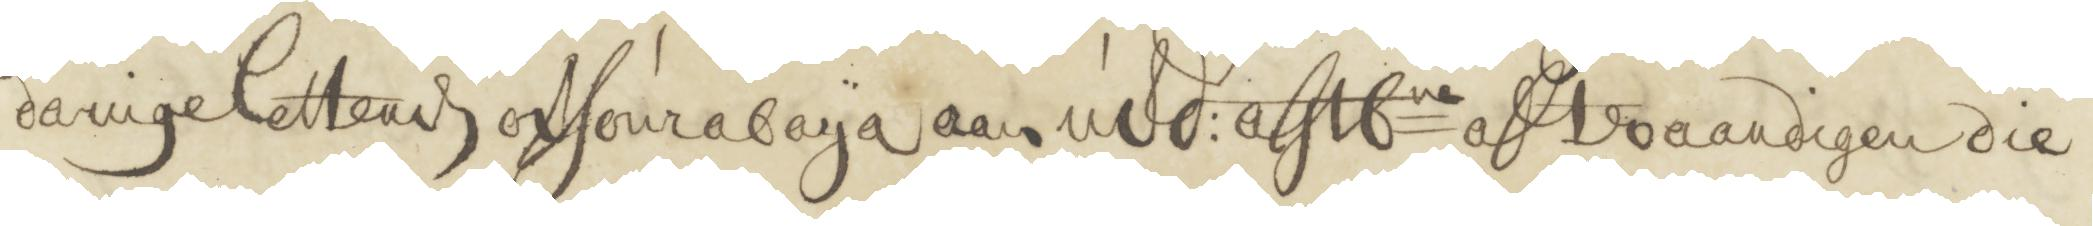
danige letteren over Sourabaija aan uEd: agtb=re af te vaardigen die
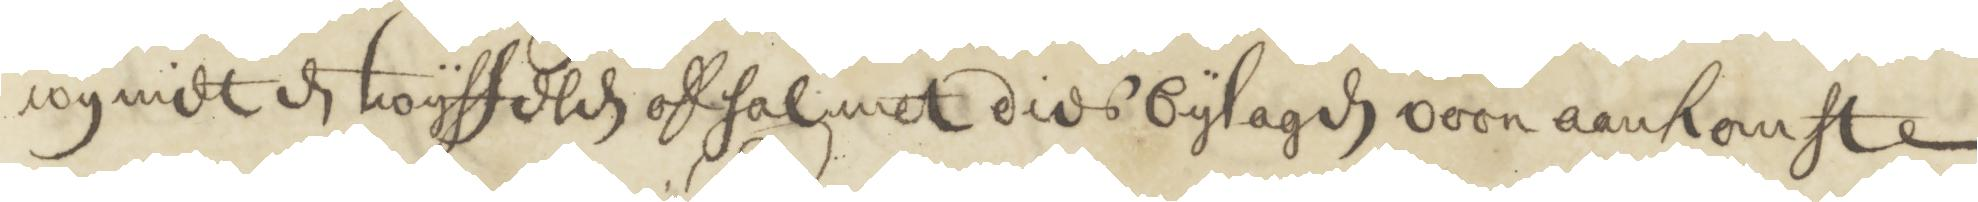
wij niet en twijffelen of sal met dies bijlagen voor aankomste
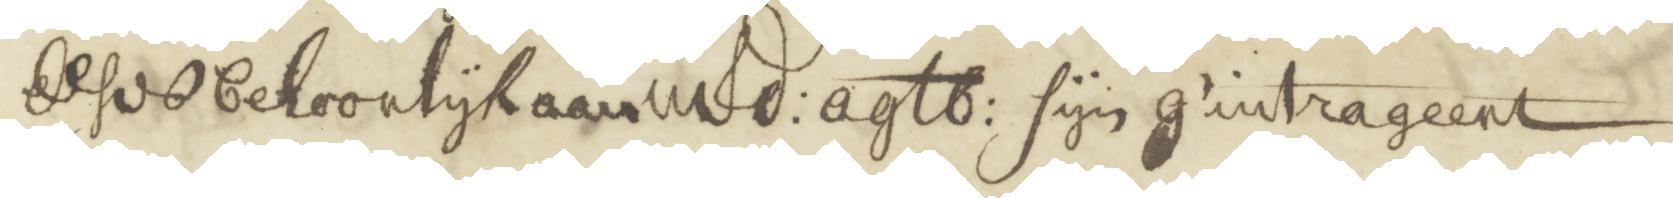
deses behoorlijk aan uEd: agtb: sijn g’intrageert
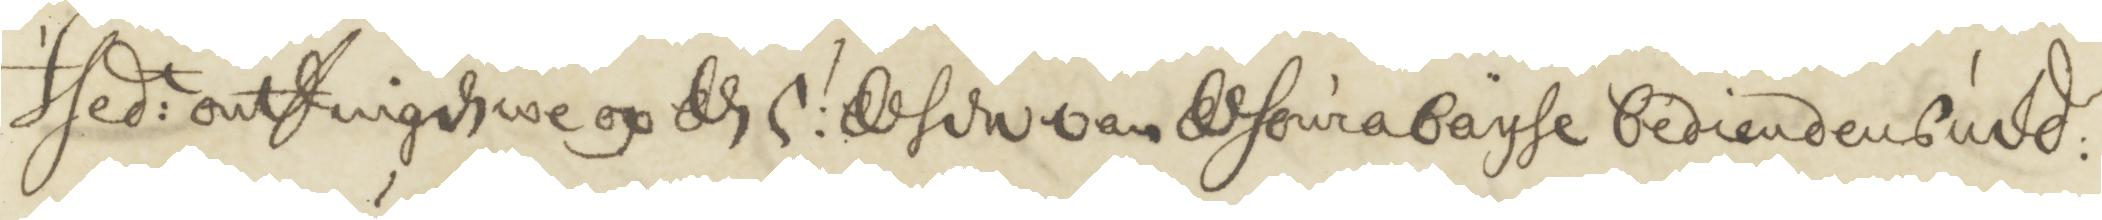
't Sed:t ontfingen we op den 5: deser van de Sourabaijse bediendens uEd:
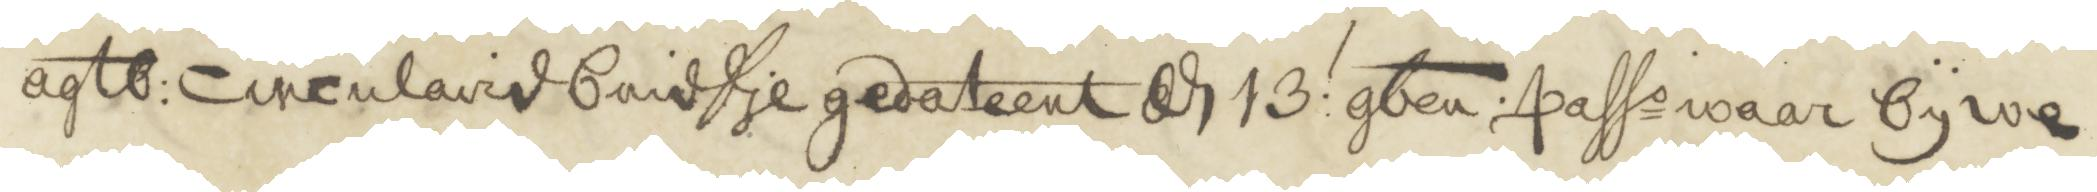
agtb: circularie briefje gedateert den 13:' 9ber: pass=o waar bij we
